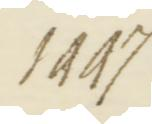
1447
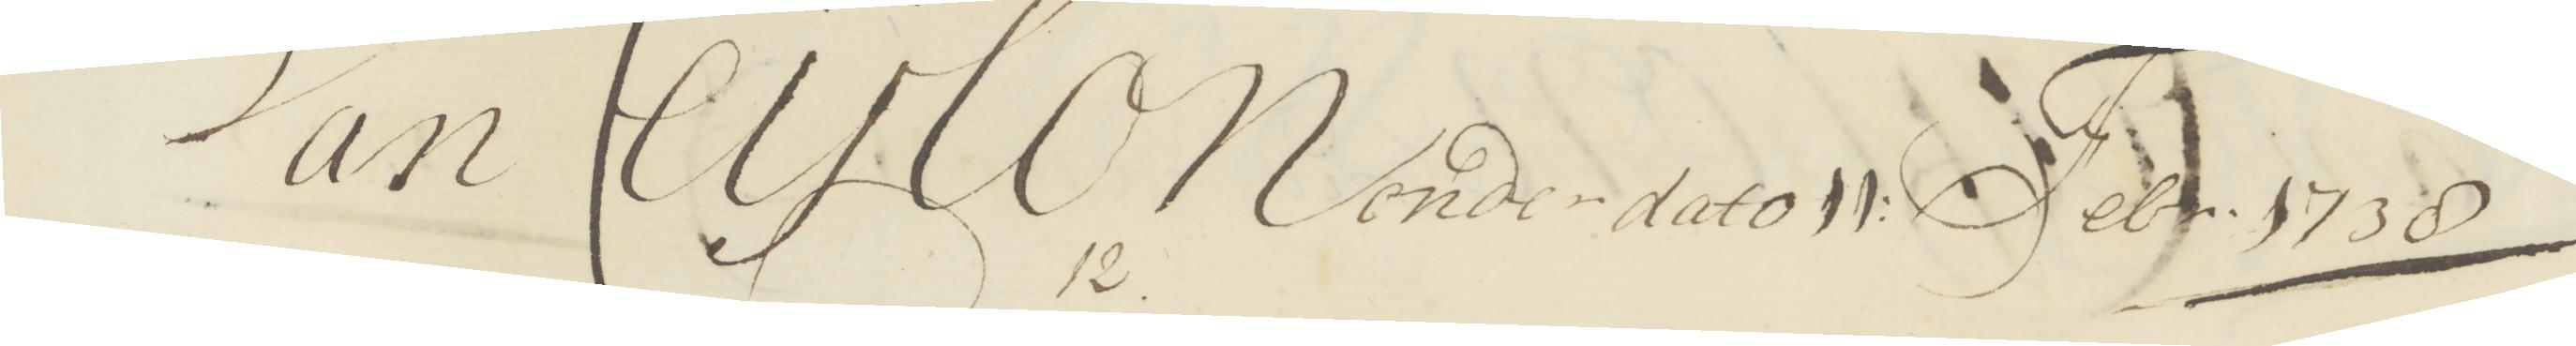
Van Ceijlon onder dato 11: Febr. 1738
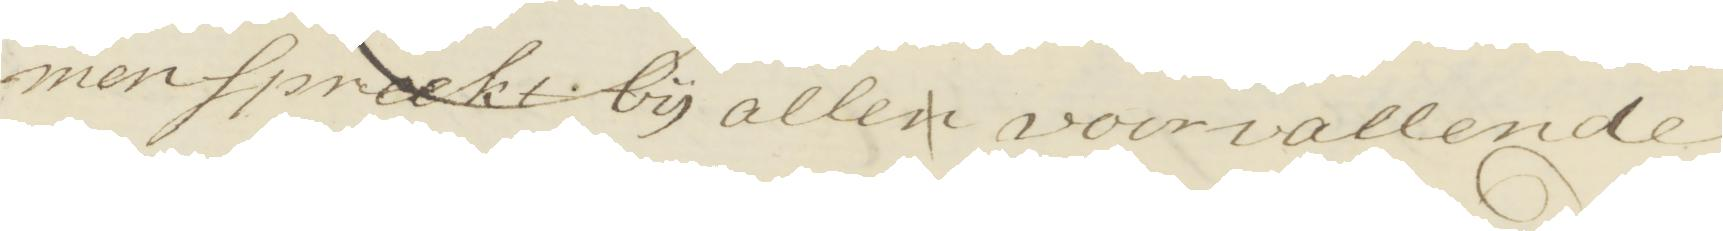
men spreekt bij allen voor vallende
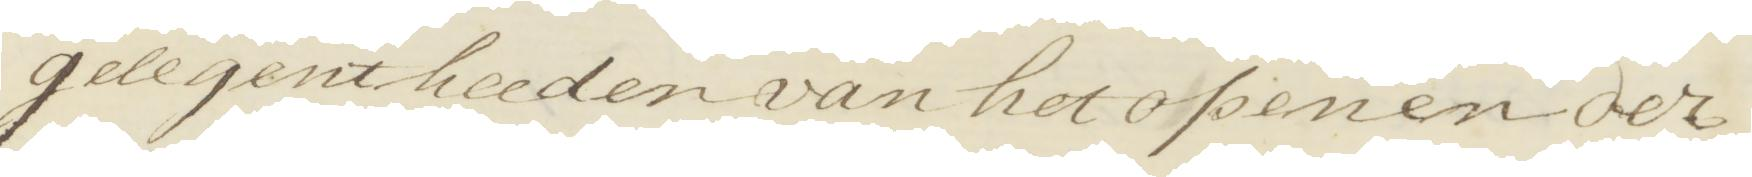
gelegentheeden van het openen der
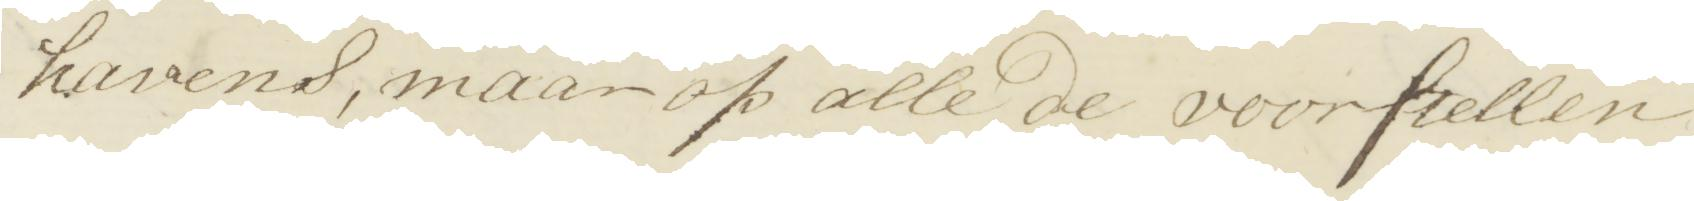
havens, maar op alle de voorstellen
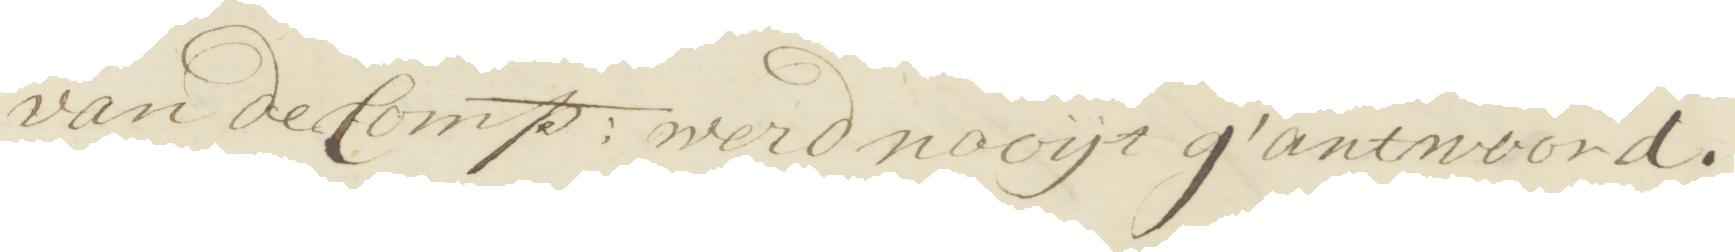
van de Comp: werd nooijt g’antwoord.
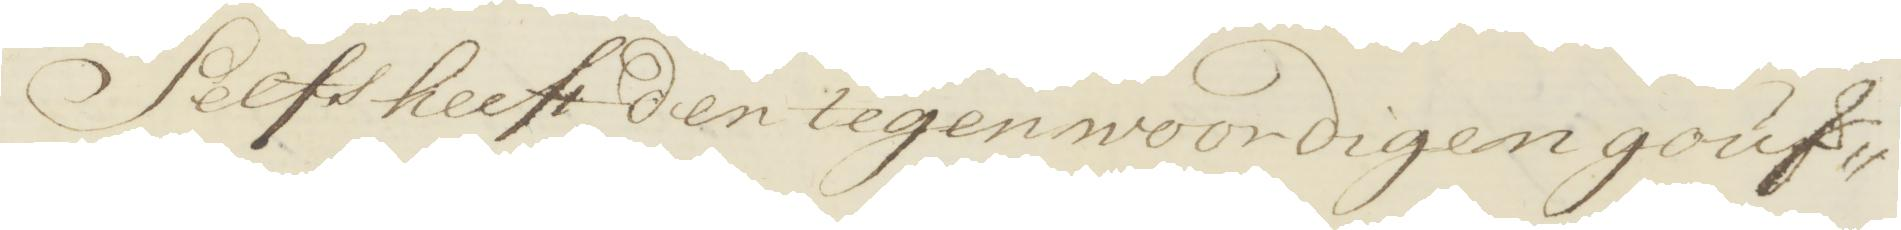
Selfs heeft den tegenwoordigen gouver„
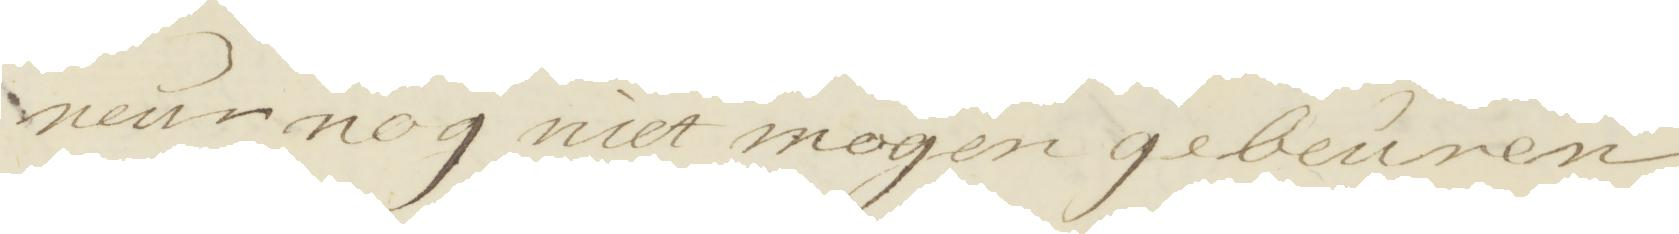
neur nog niet mogen gebeuren
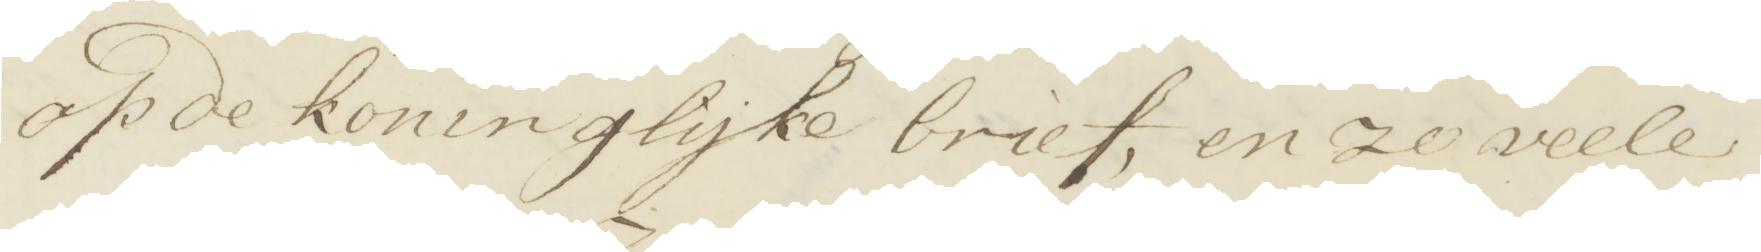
op de koninglijke brief, en zo veele
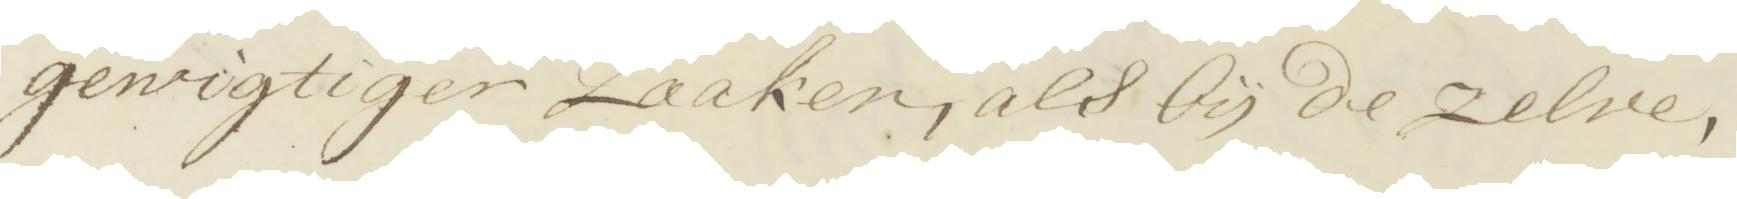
gewigtiger zaaken, als bij de zelve,
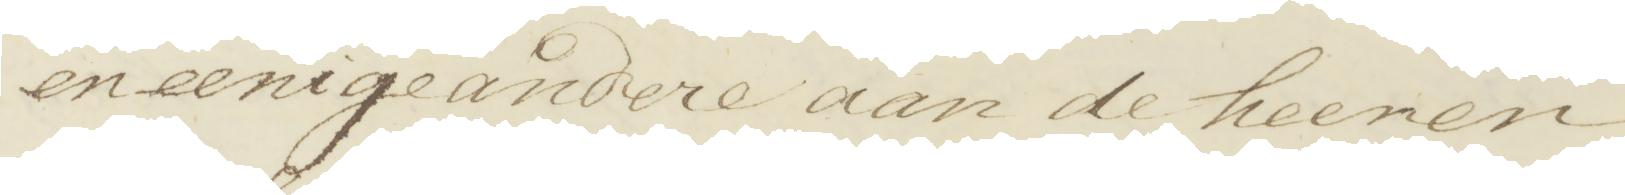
en eenige andere aan de heeren
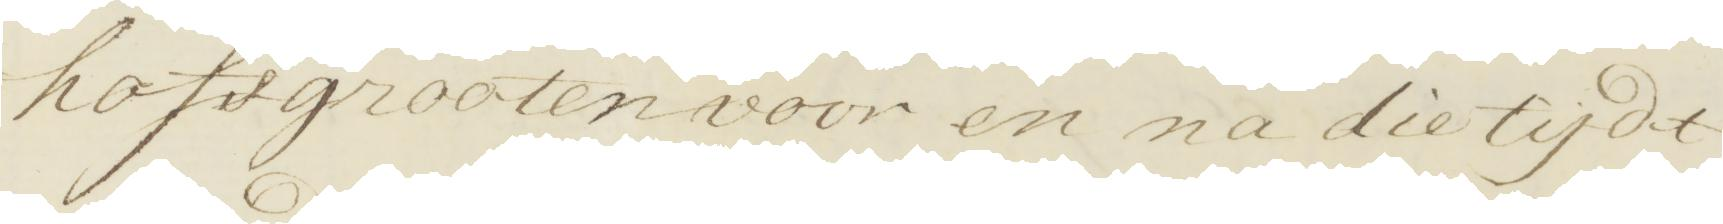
hofsgrooten voor en na die tijdt
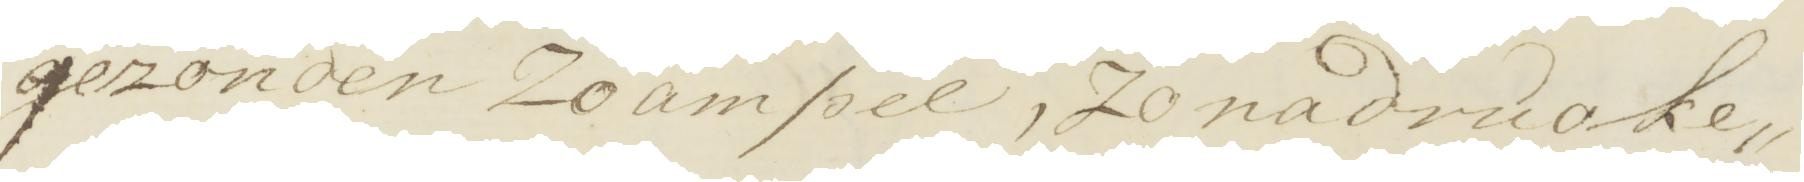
gezonden zo ampel, zo nadrucke„
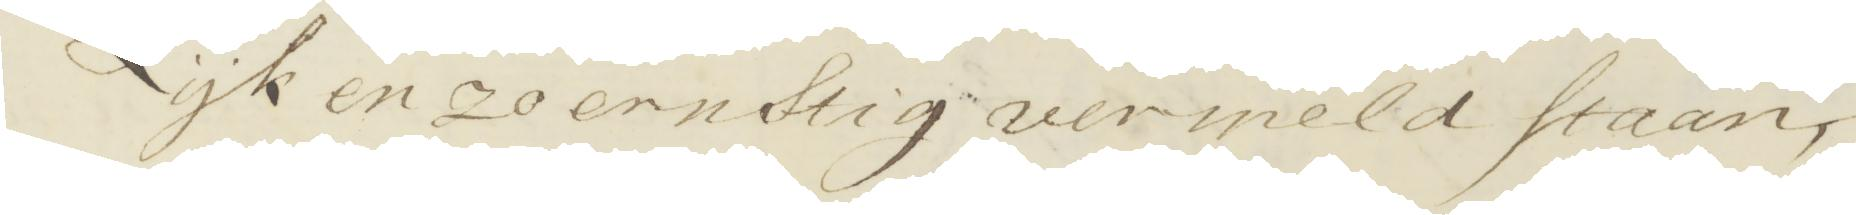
Lijk en zo ernstig vermeld staan,
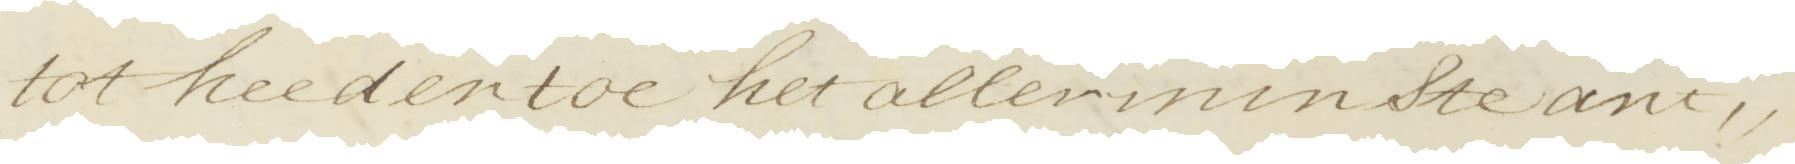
tot heeden toe het allerminste ant„
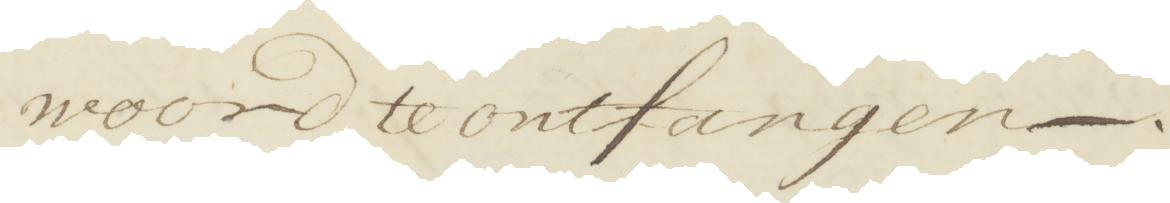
woord te ontfangen.
